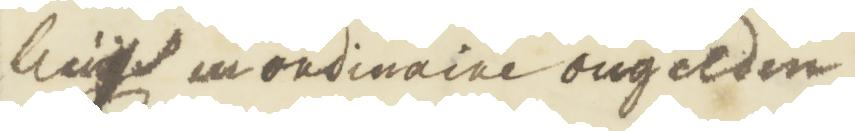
huijs en ordinaire ongelden
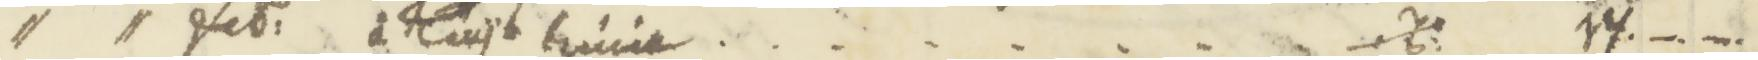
„ „ feb:y â huijs . . . . . . . . r:o 17.–.–.
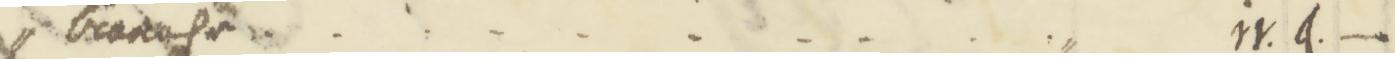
„ kaarse . . . . . . . . . . . „ 11. 4.–
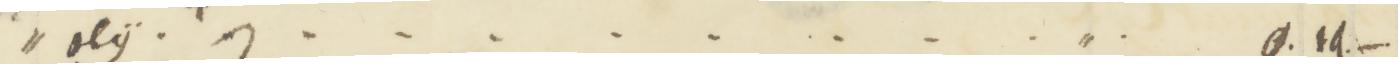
„ olij . . . . . . . . . . „ . 9.14.–.
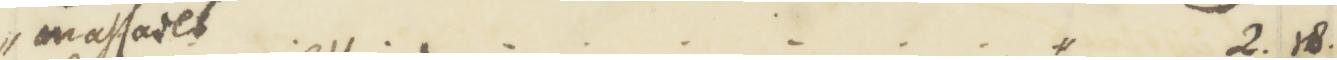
„ massaels . . . . . . . . . „ 2. 18.
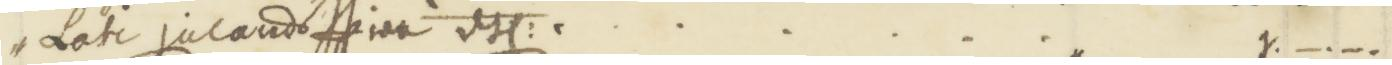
„ Lak jnlands pier etc: . . . . . . . „ 1.–.–.
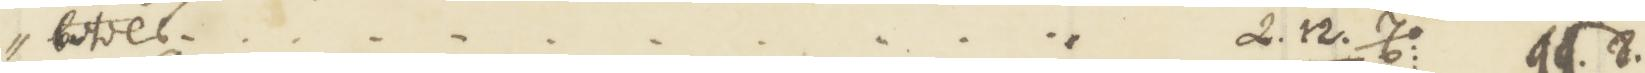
„ betels - . . - - . . . . . . „ 2.12. r:o 44. 8.
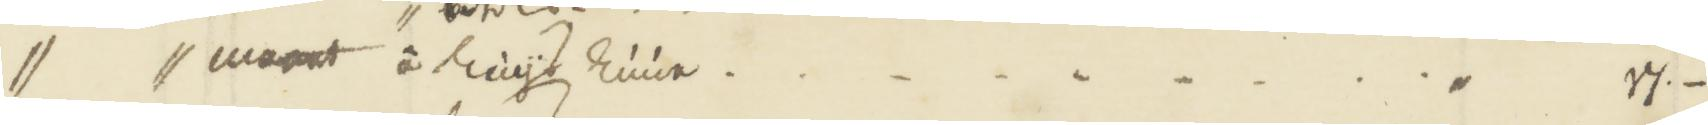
„ maart â huijs huur . . - - - - - . . „ 17.–
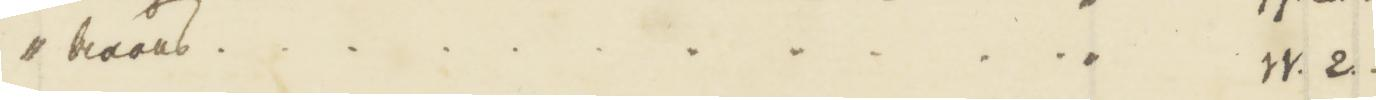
„ kaars . . . . . . . . . . . „ 11. 2.
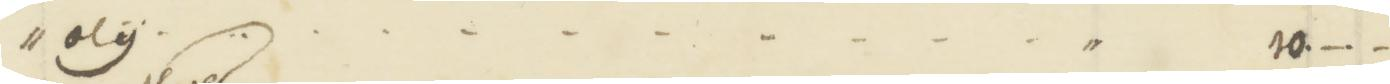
„ olij . . . . .- - - - - - - „ 10.–.
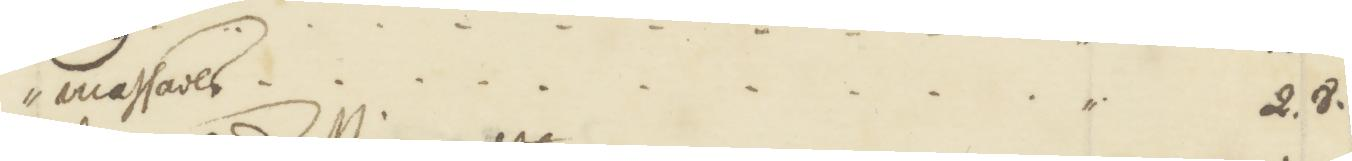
„ massaels . . . . . . . . . . „. 2.8
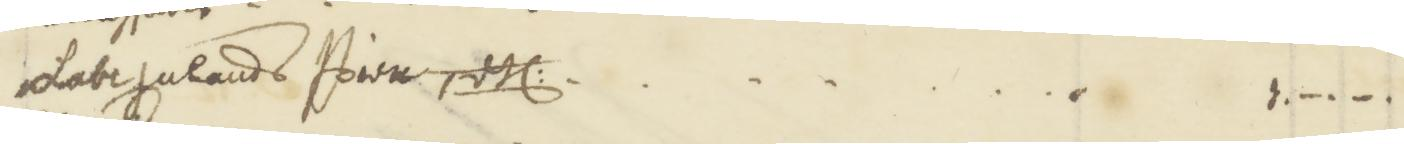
Lak Jnlands ppier etc: . . - - . . . „ 1.–.–.
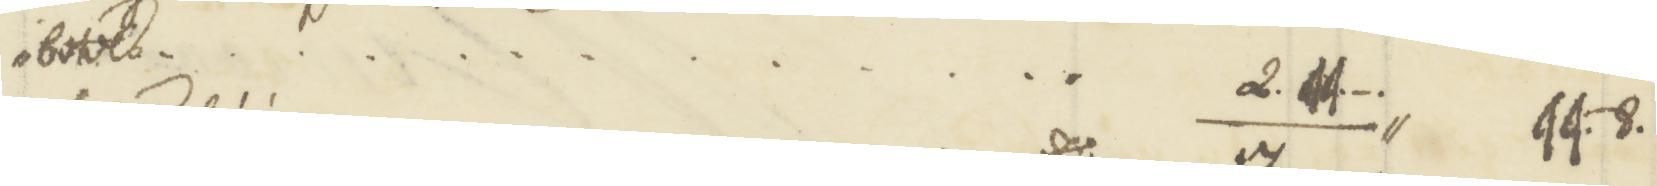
betels . . . . . . . . . . . . „ 2.44.–. „ 44:8.
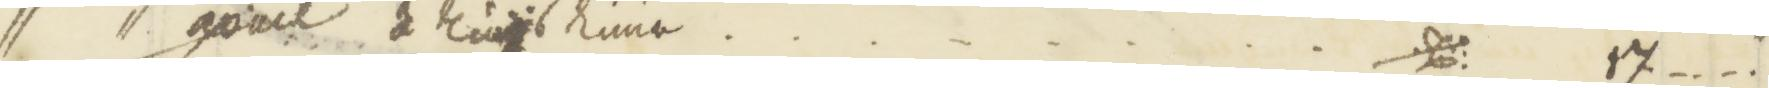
„ „ april â huijs huur . . . - - . . . . r:o 17.–.–.
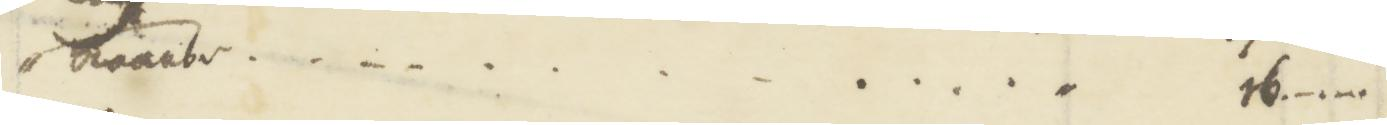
„ Kaarse . . . . . . . . . . . . „ 16.–.–.
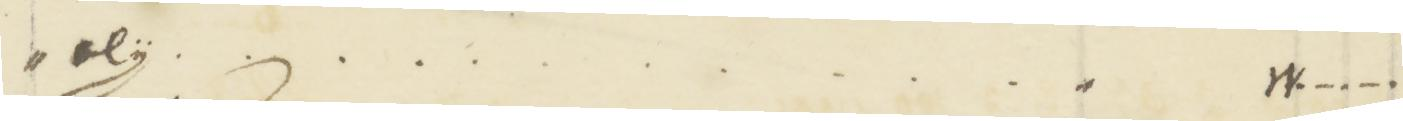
„ olij . . . . . . . . . . . „ 11.–.–.
